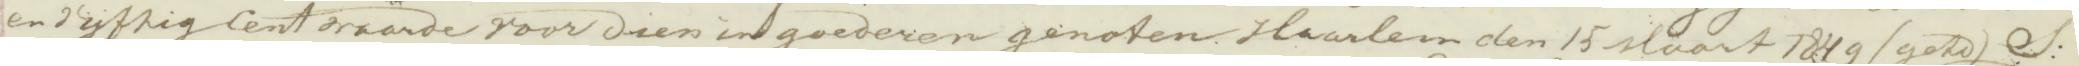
en vijftig Cent waarde voor dien in goederen genoten Haarlem den 15 Maart 1849 (getd) S:
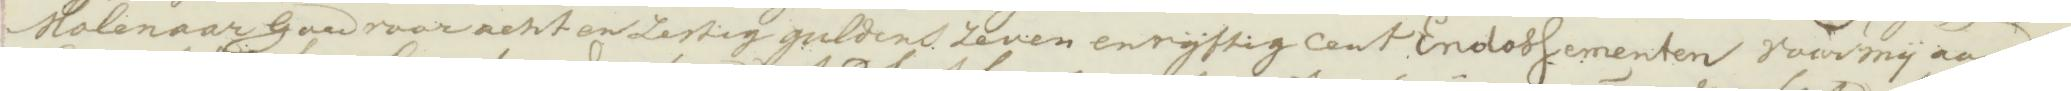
Molenaar Goed voor acht en Zestig guldens zeven en vijftig cent Endossementen voor mij aan de
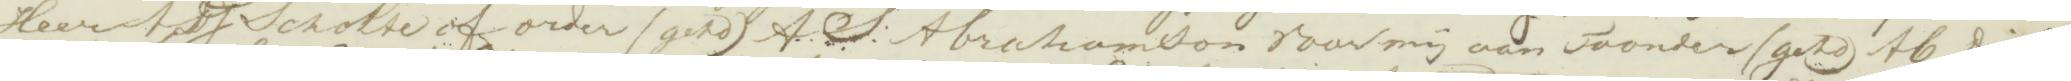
Heer A. J. Scholte of order /getd/ A: S: Abrahamson voor mij van Hoonder (getd) Ab Dirk
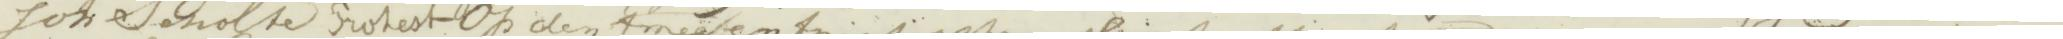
Joh Scholte Protest Op den twee en twintigsten Mei Achttienhonderd negen en Veertig heb ik
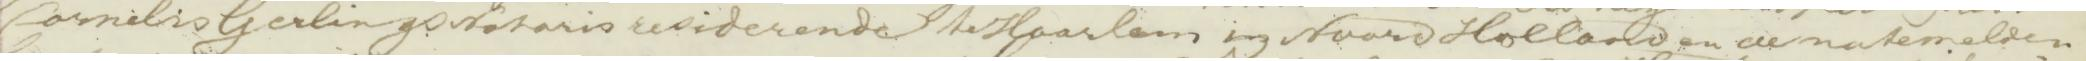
Cornelis Gerlings Notaris residerende te Haarlem in Noord Holland en de natemelden
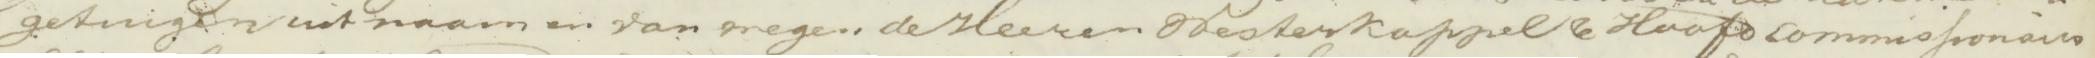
getuigen uitnaam en van wegen de Heeren Westerkappel te Hoofd commissionair
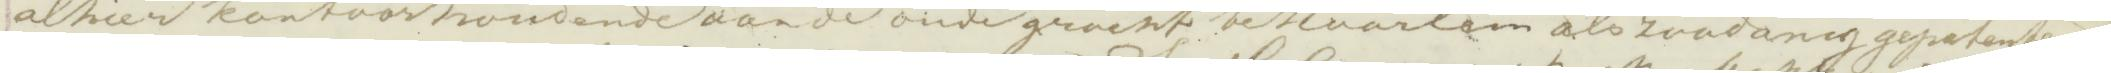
alhier kantoorhoudende aan de onde gracht te Haarlem als zoodanig gepatenteerd
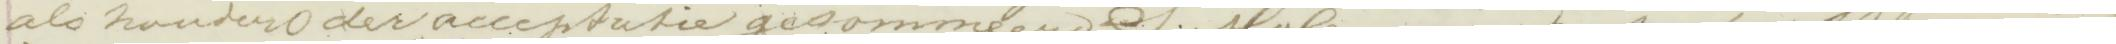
als houder der acceptatie gesommeerd S: Molenaar koekenbakker wonende
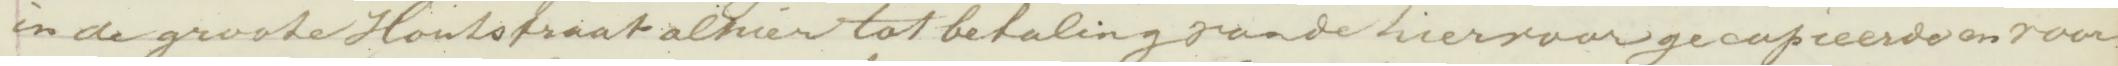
in de groote Houtstraat alhier tot betaling van de hiervoor gecapieerde en voor
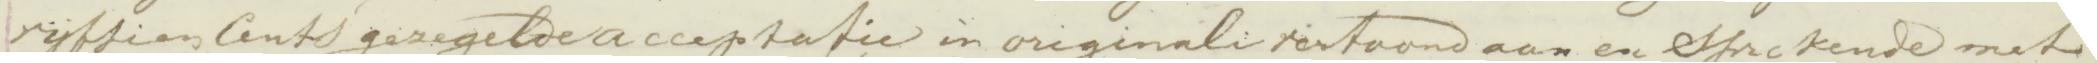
vijftien Cents gezegelde acceptatie in originali vertoond aan en sprekende met
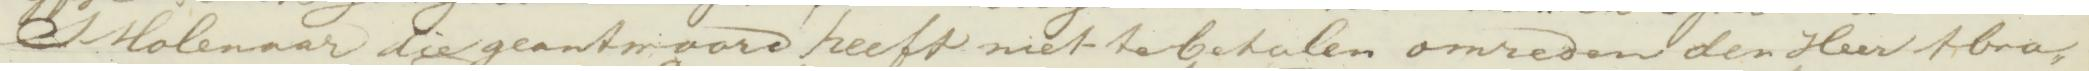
Molenaar die geantwoord heeft niet te betalen omreden den Heer Abra„
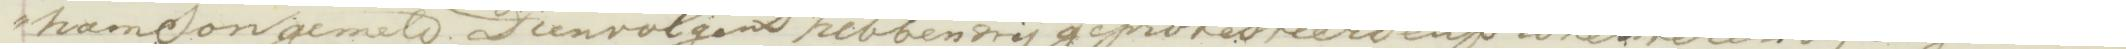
„ham songemeld. Dienvolgens hebben wij geprotesteerd en protesteren bij dezen van
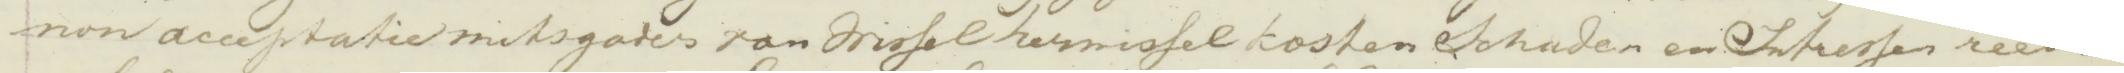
non acceptatie mitsgader van Wissel herwissel kosten schaden en Intressen reeds
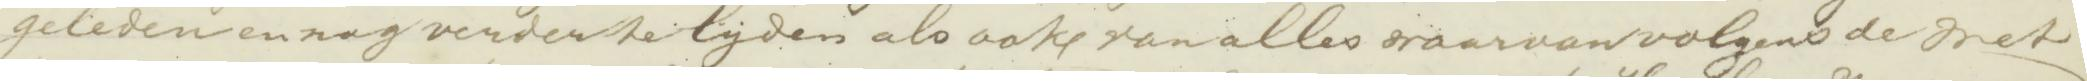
geleden en nog verder te lijden als ook van alles waarvan volgens de wet
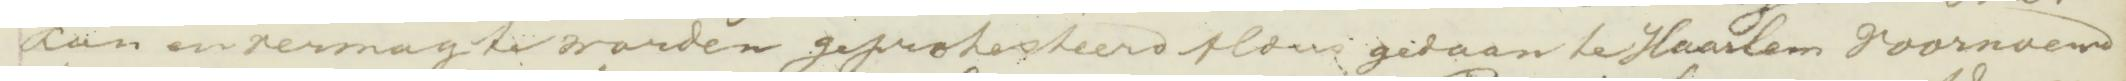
kan en vermagte worden geprotesteerd Aldus gedaan te Haarlem voornoemd
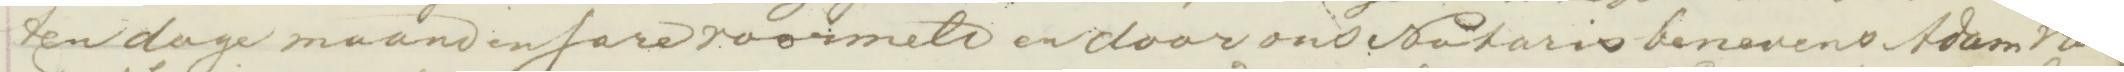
ten dage maand en jare voormeld en door ons Notaris benevens Adam van
